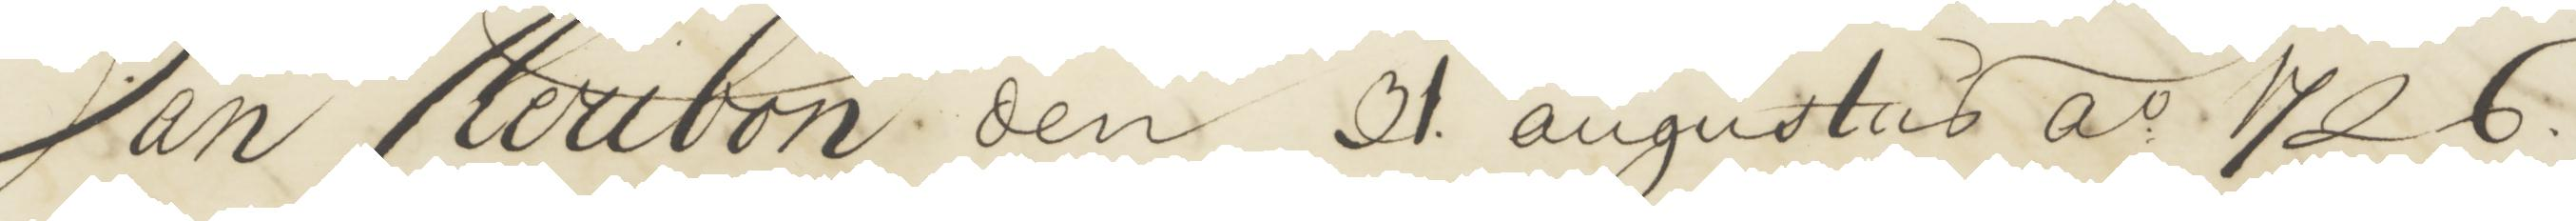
Van Cheribon den 31. augustus a:o 1726.
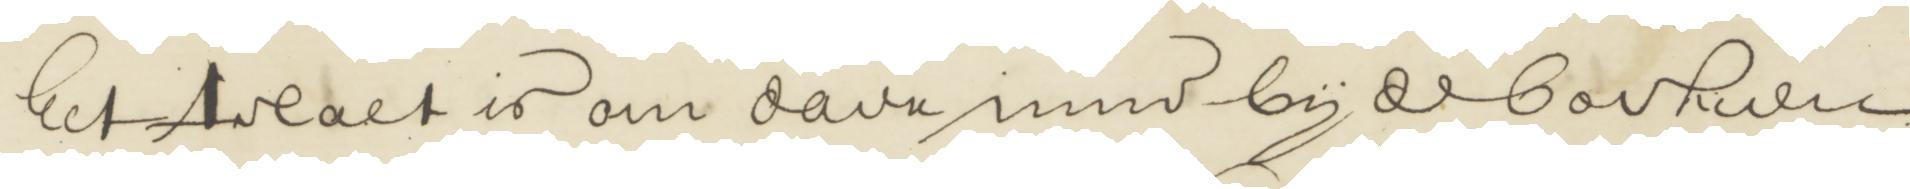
het te laet is om daer inne bij de boeken
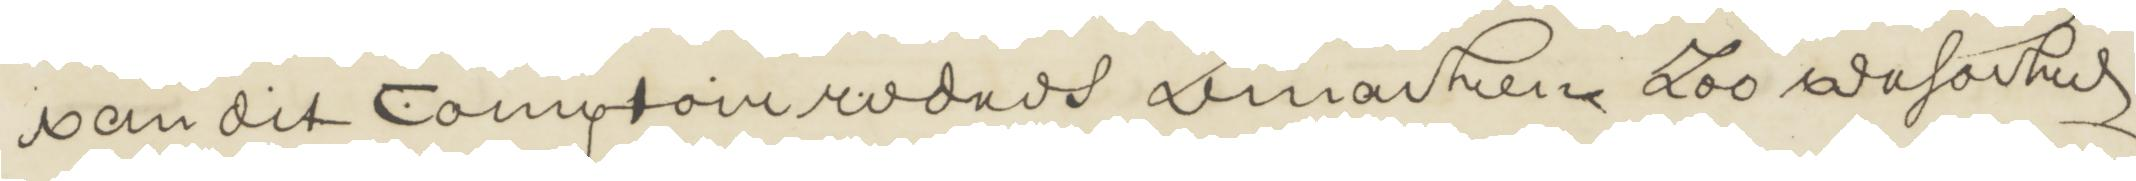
van dit comptoir redres te maeken Zoo versoeken
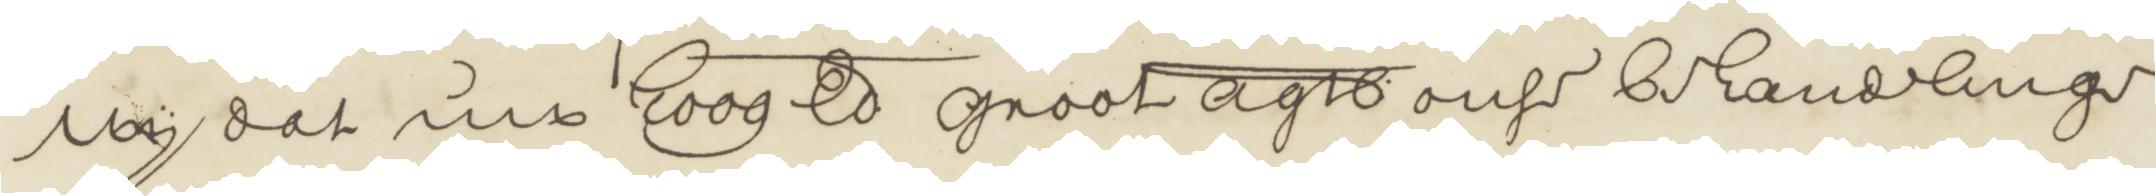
wij dat uw hoog Ed. groot agtb. onse behandelinge
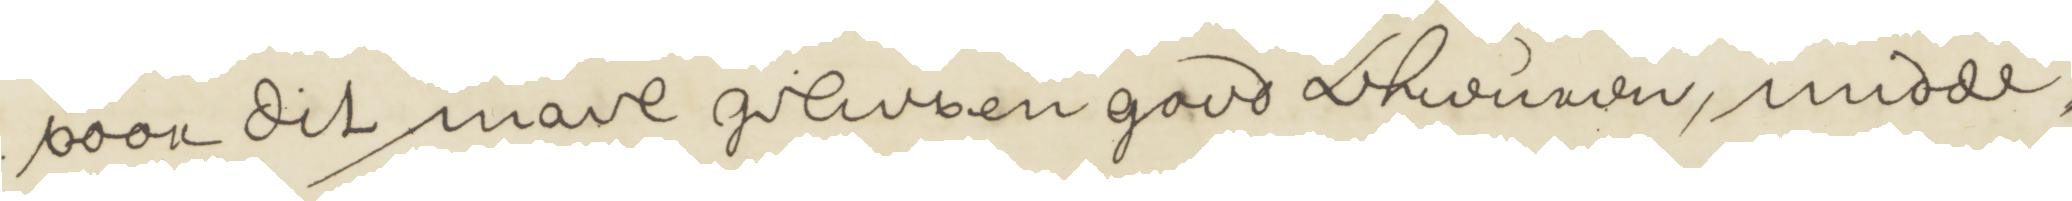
voor dit mael gelieven goed te keuren, midde
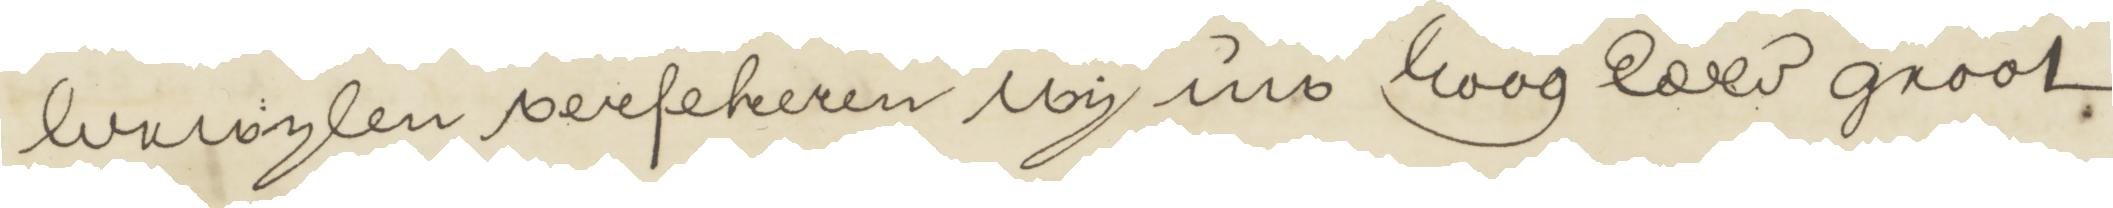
lerwijlen versekeren wij uw hoog Edele groot
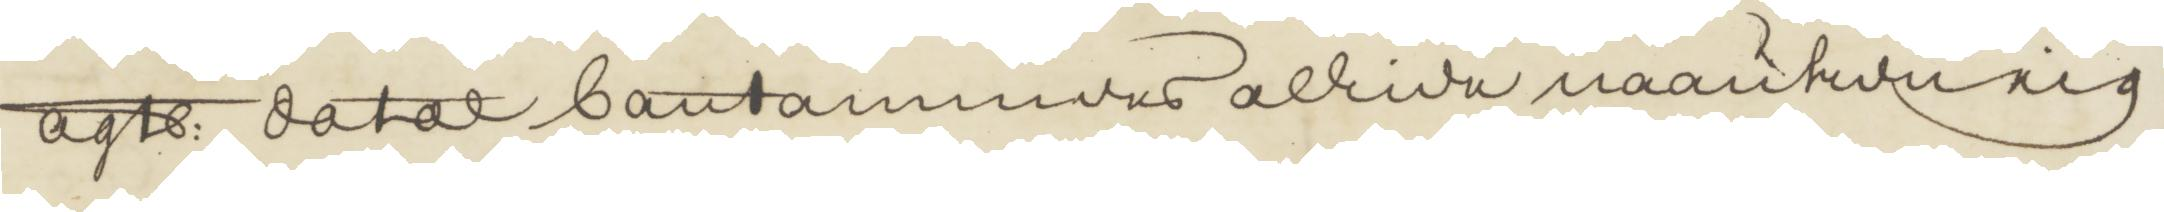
agtb: dat al bantammers alhier naaukeurig
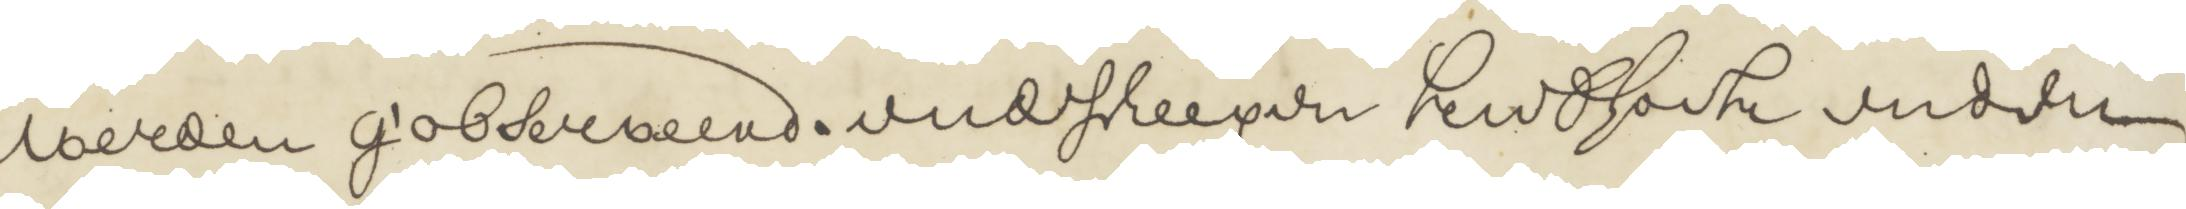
werden g’observeerd. en de scheepen kiefhoek en den
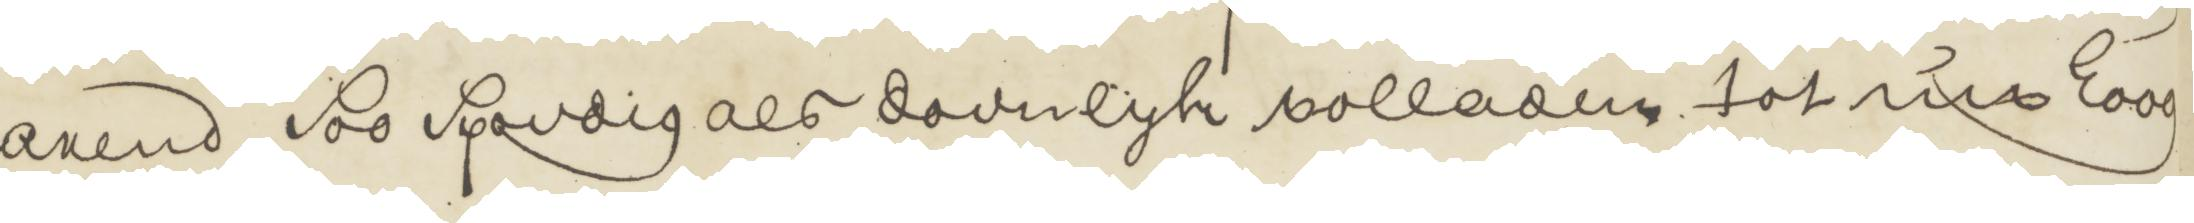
arend Soo Spoedig als doenlijk volladen tot uw hoog
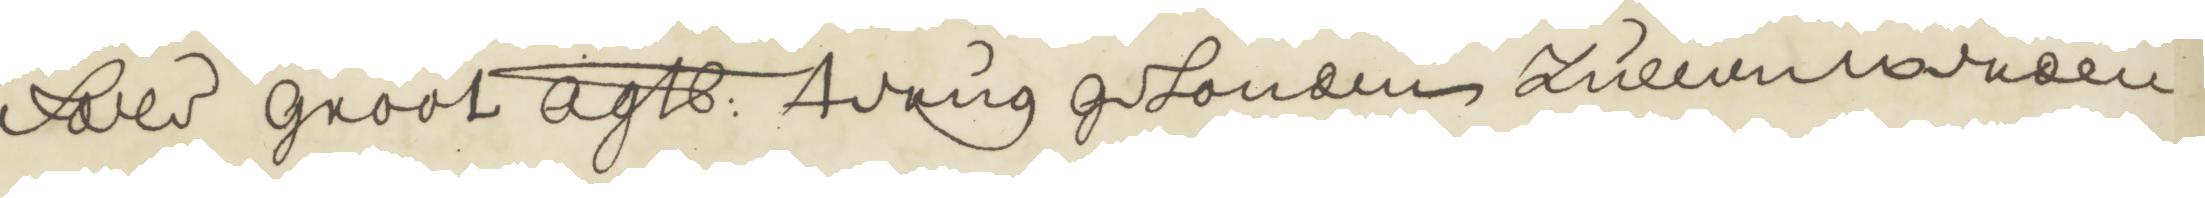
Edele groot agtb: terug gesonden Zullen werden
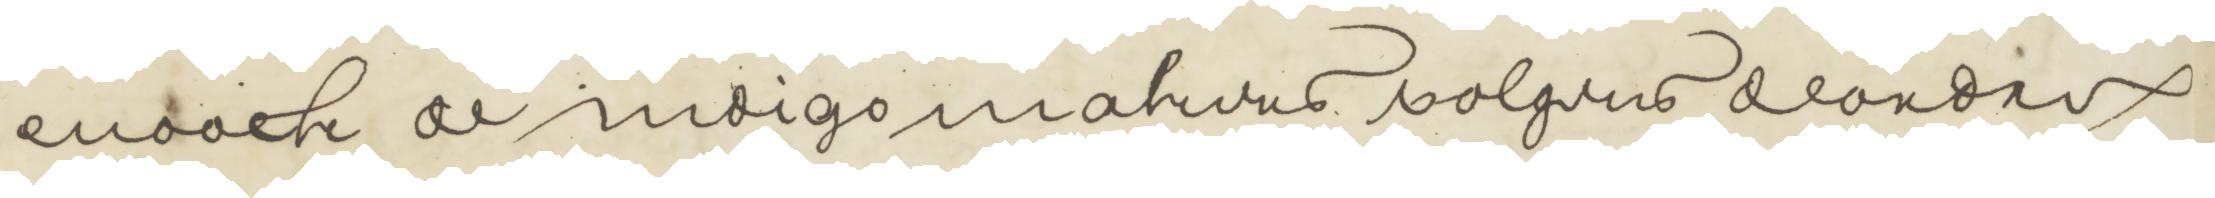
en oock de indigo makers volgens de ordre
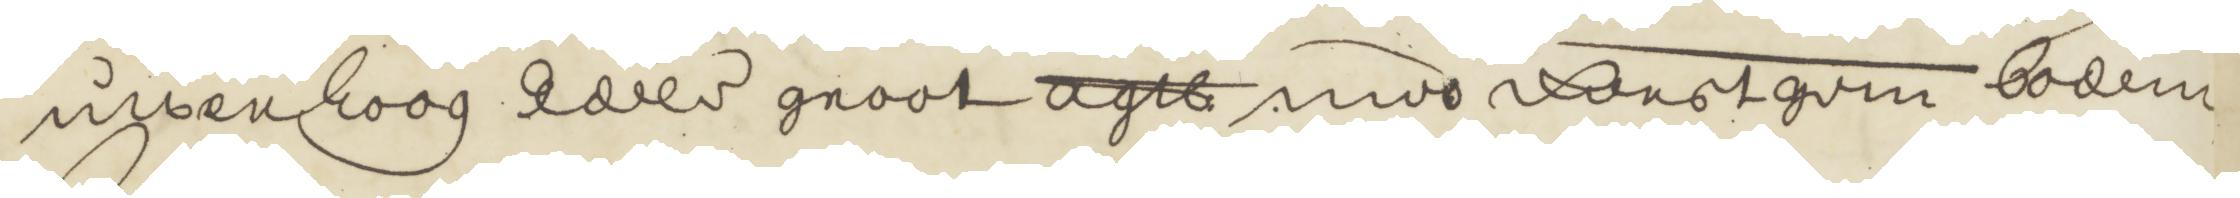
uwer hoog Edele groot agtb med Eerstgem bodem
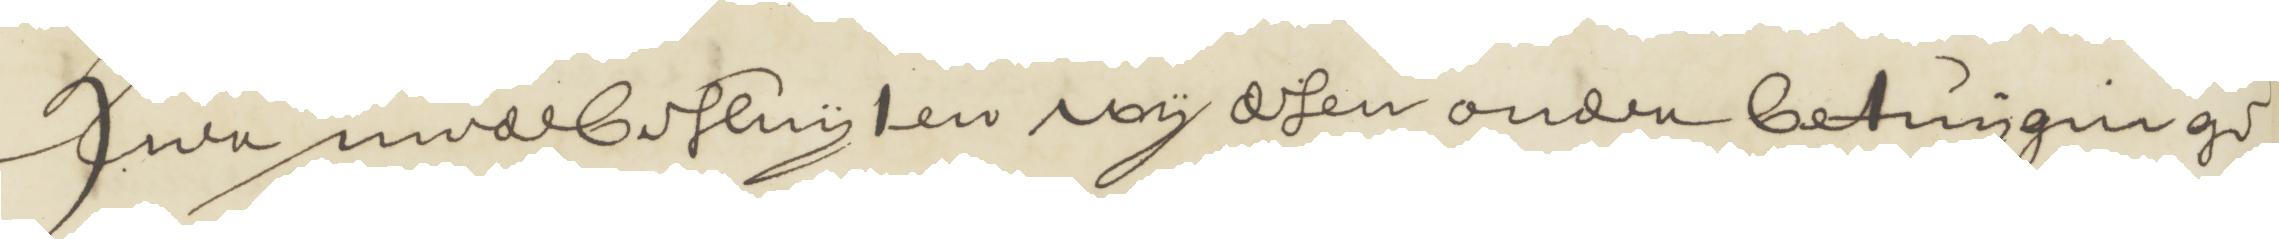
Hier medebesluijten wij desen onder betuijginge
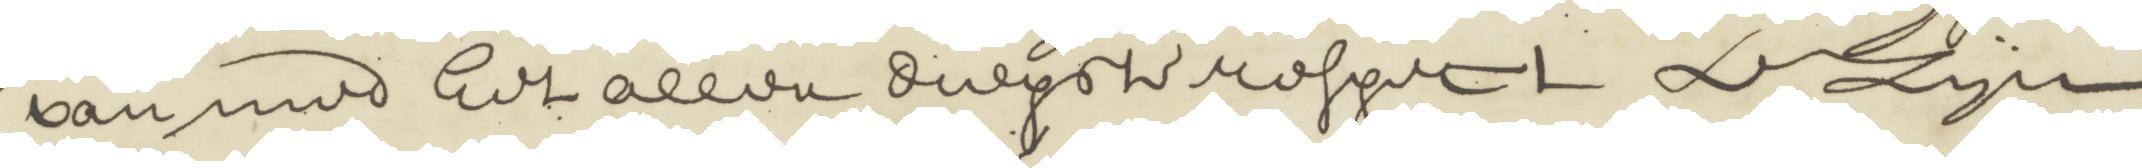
van med het aller diepste respect te Zijn
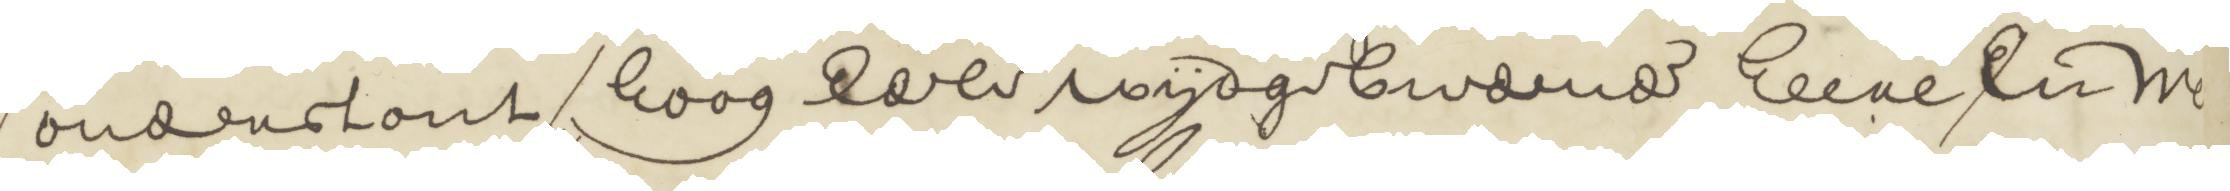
/onder stont/ hoog Edele wijd gebiedende heere En we
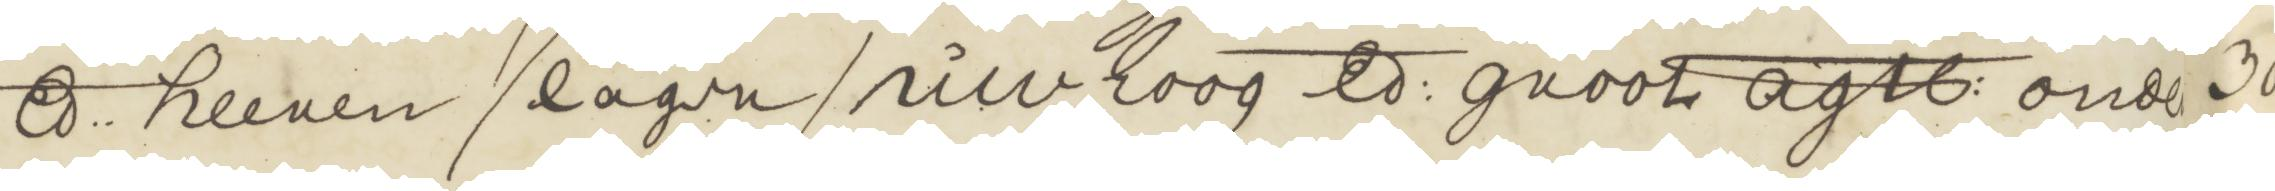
Ed.. heeren / lager/ uw hoog Ed: groot agtb: onder
